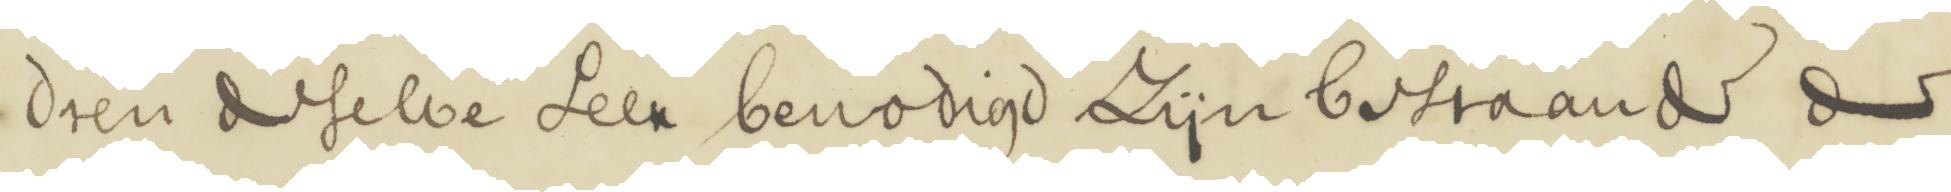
dien deselve seer benodigd zijn bestaande de
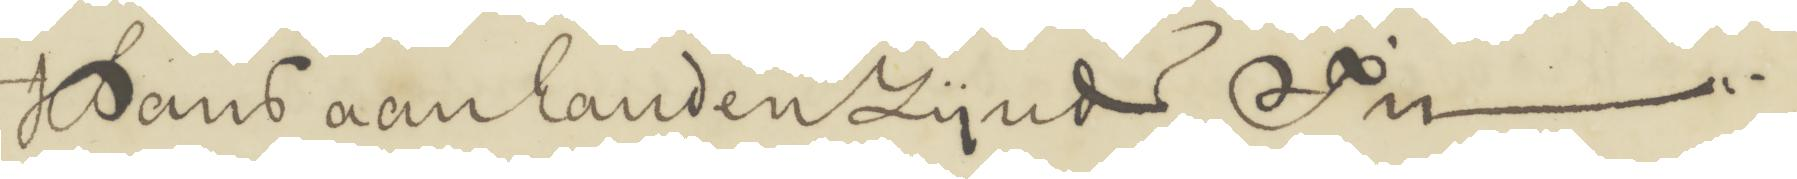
thans aanhanden zijnde In:.
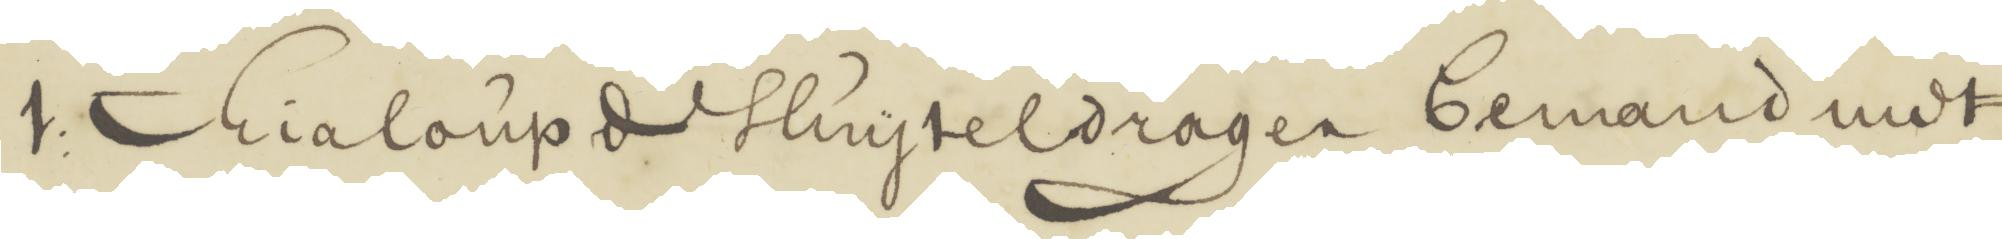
1: Chialoup de sluijteldrager bemand met
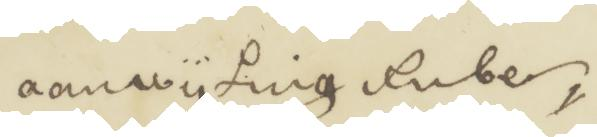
aanwijsing en be„
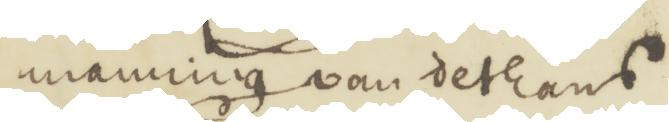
manning van de thans
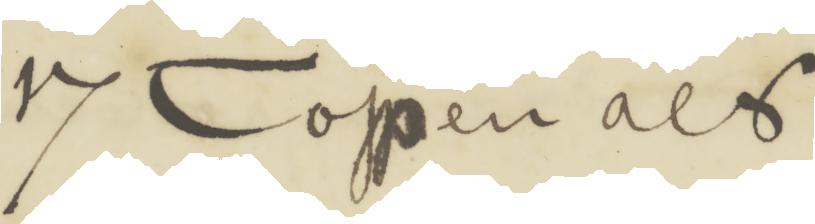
17 Coppen als
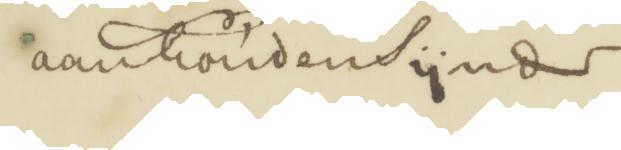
aanhanden sijnde
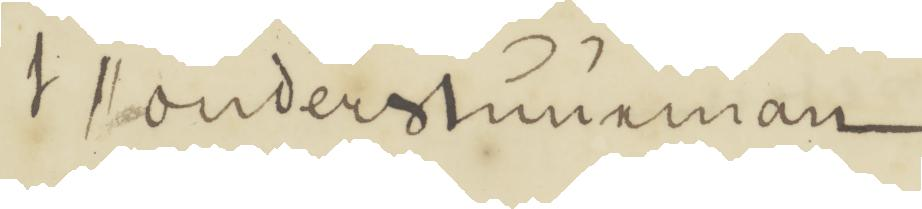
1: // onderstuurman
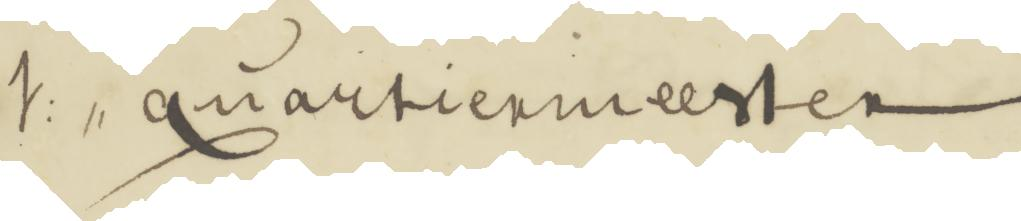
1:„ quartiermeerter
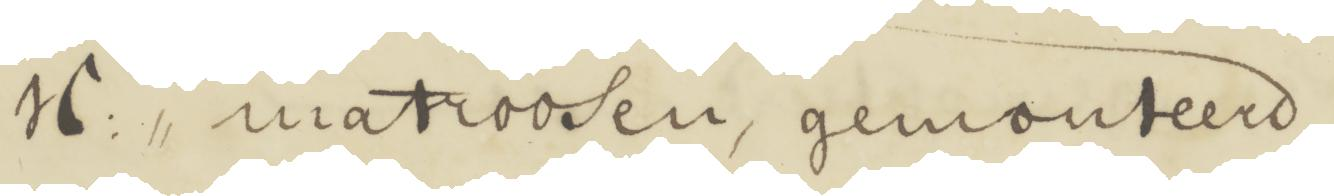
15: „ matroosen, gemonteerd
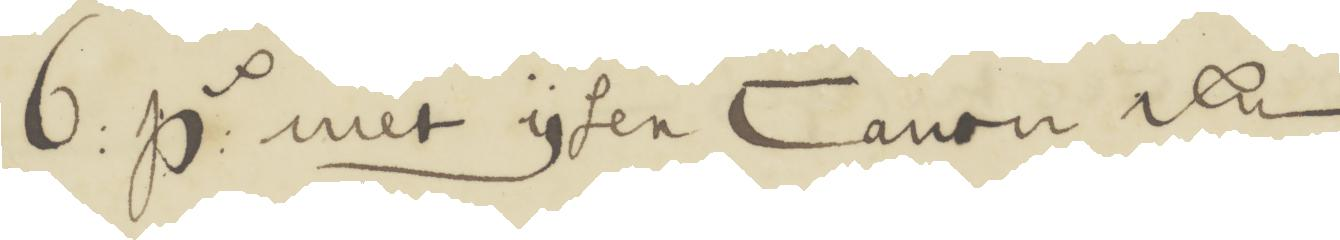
6: p:s met ijser Canon en
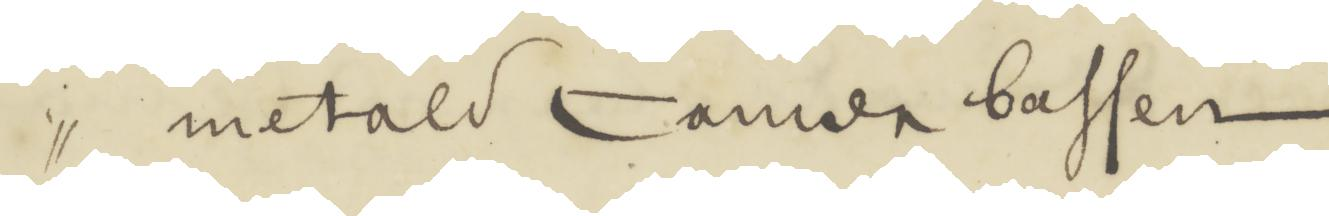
4: „ metale Camer bassen
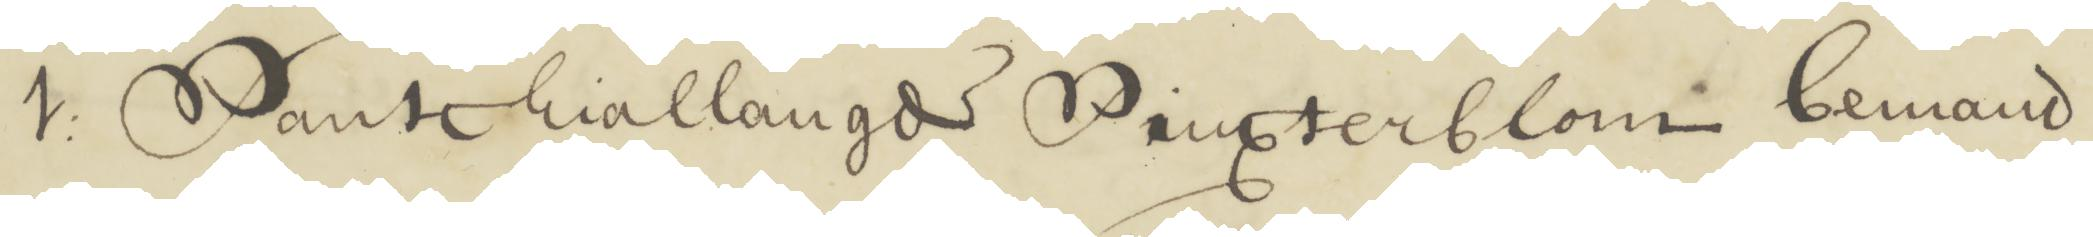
1: Pantchiallang de Pinxterblom bemand
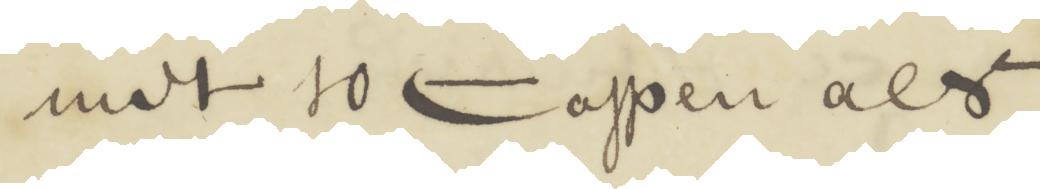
met 10 Coppen als
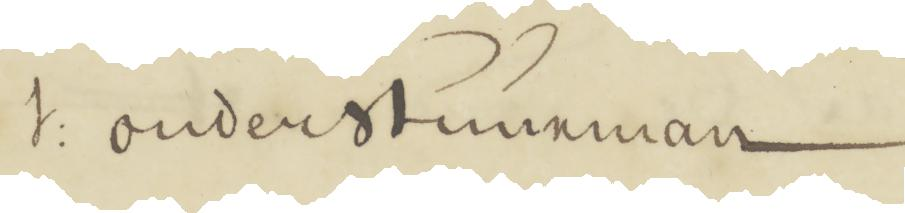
1: onderstuurman
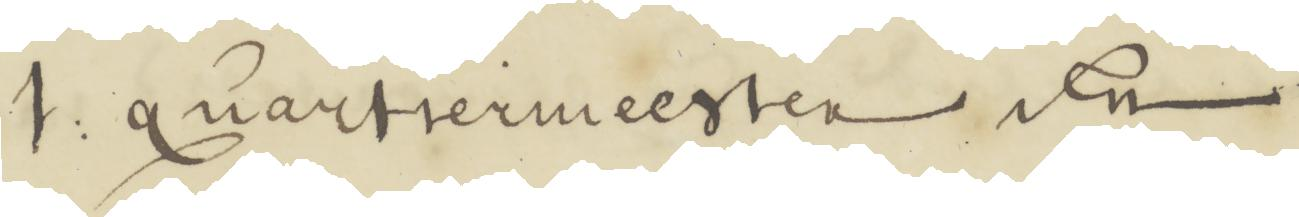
1: quartiermeester en
